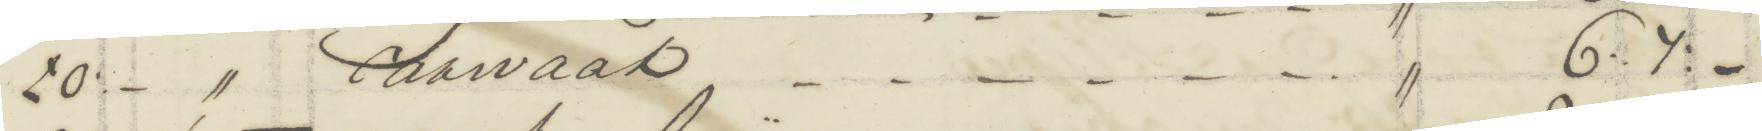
20:— „ Carwaat - - - - - - „ 6:7:—
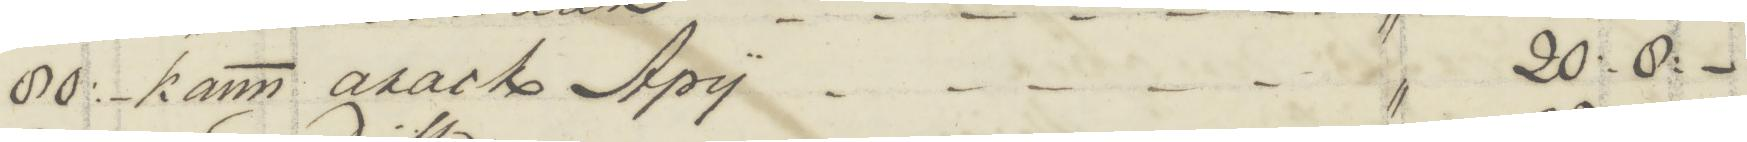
80:— kann arack Apij - - - - - „ 20: 8:—
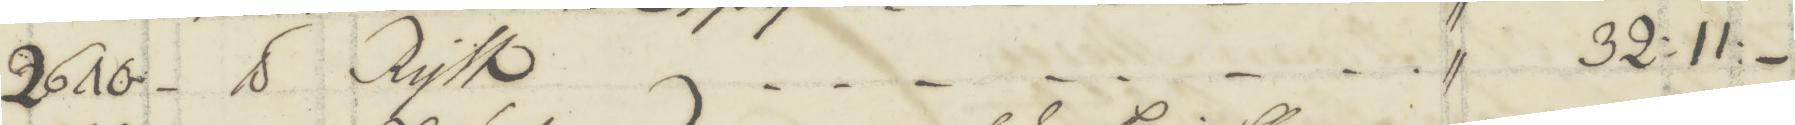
2640.— lb Rijst - - - - - - - „ 32:11:—
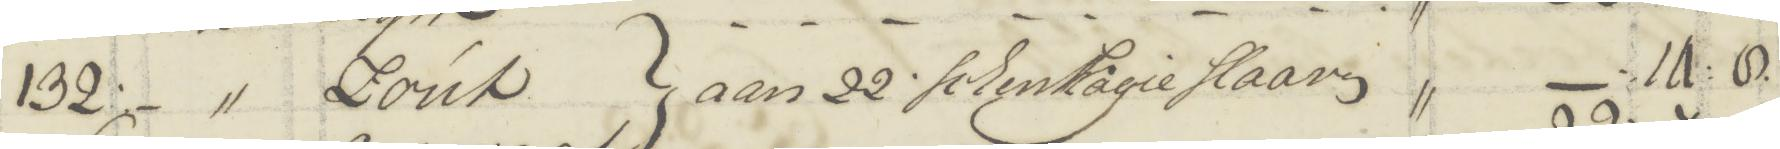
132:— „ Zout } aan 22 schenkagie slaaven „ —:14: 8.
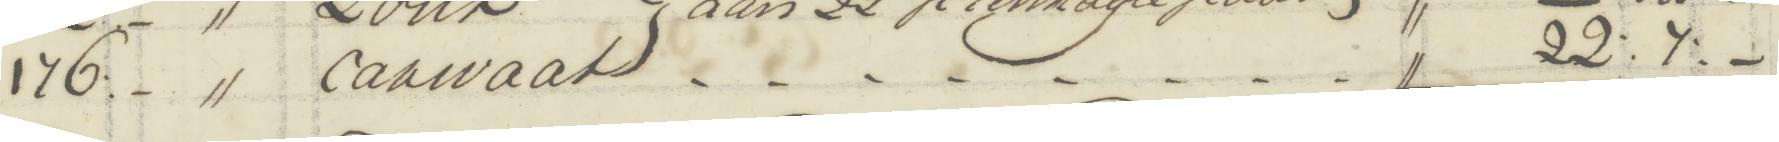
176:— „ carwaat) - - - - - - - - „ 22: 7:—
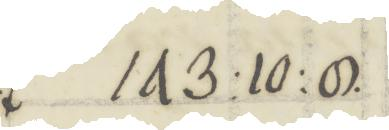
ƒ 143:10:8.
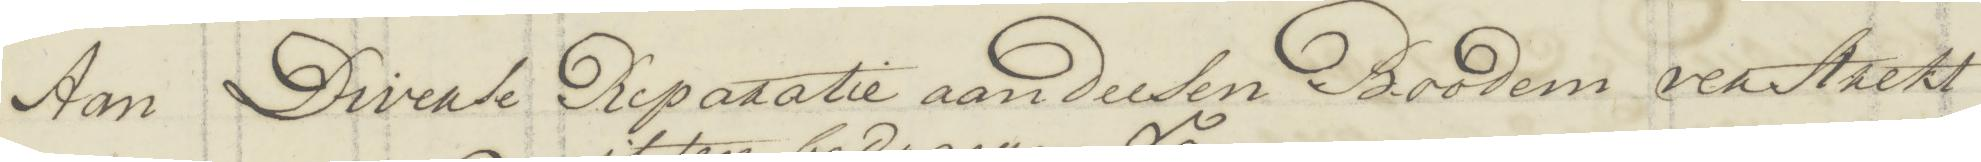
Aan Diverse Reparatie aan deesen Boodem verstrekt
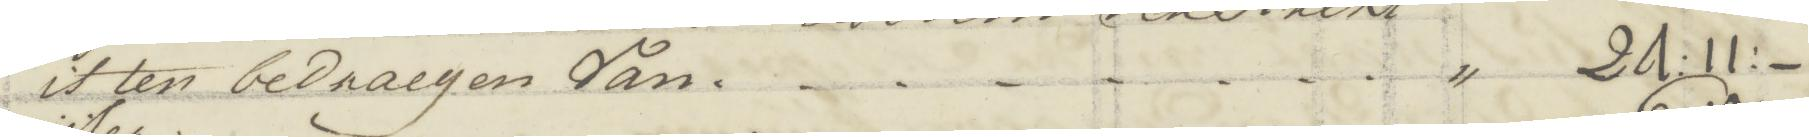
is ten bedraegen Van - - - - - - - „ 24:11:—
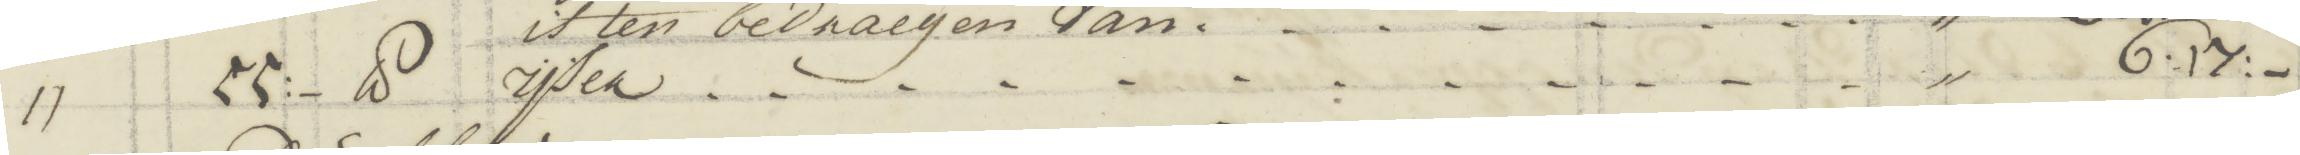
55:— lb ijser - - - - - - - - - - - - „ 6:17:—
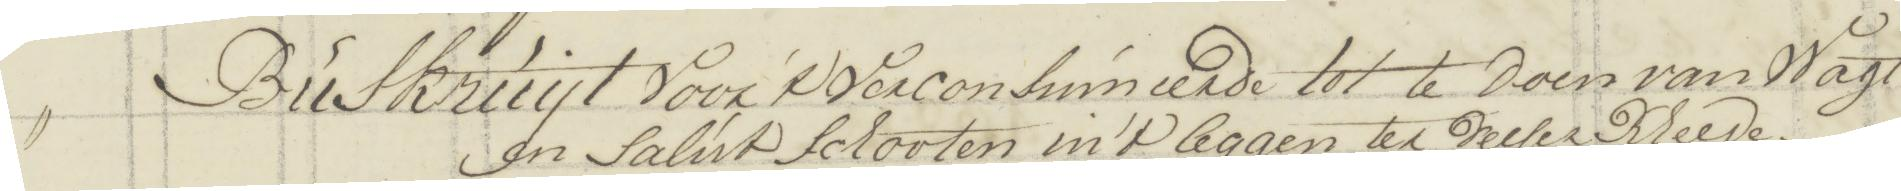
„ Buskruijt Voor ’t verconsumeerde tot te doen van Wagt
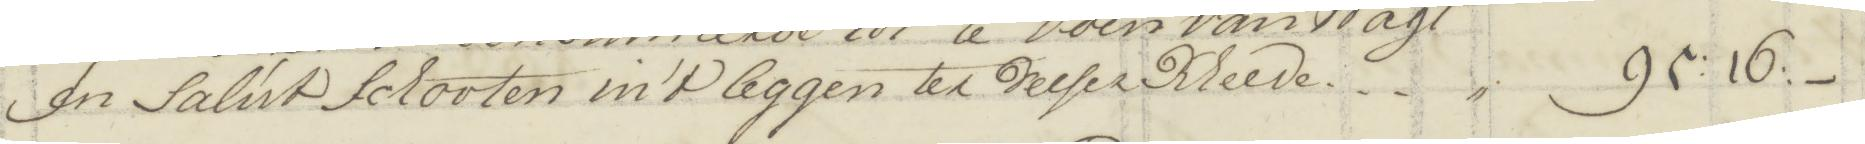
en salut schooten in ’t leggen ter deeser Rheede - - „ 95:16:—
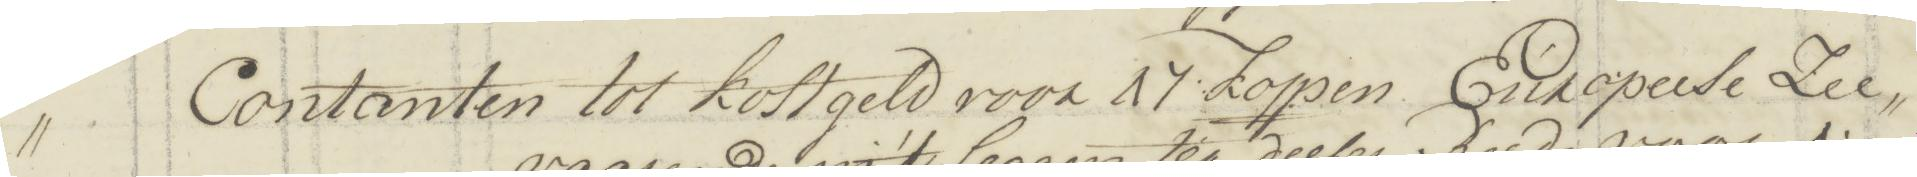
„ Contanten tot kostgeld voor 47: koppen Europeese Zee„
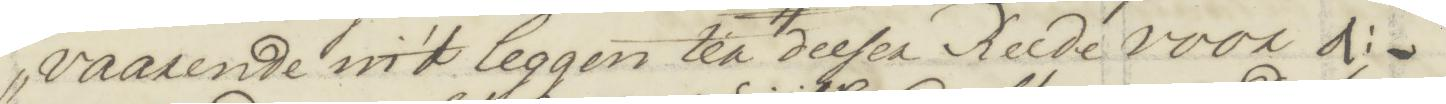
„vaarende in’t leggen ter deeser Reede voor 4:—
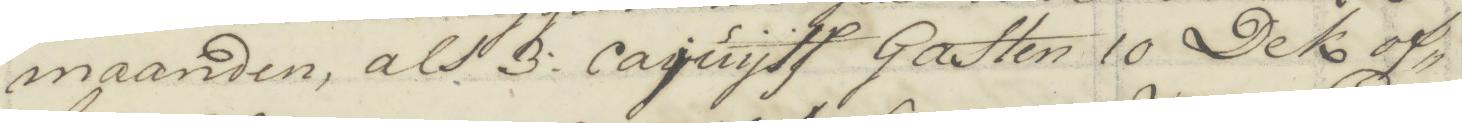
maanden, als 3: cajuijts Gasten 10 Dek of„
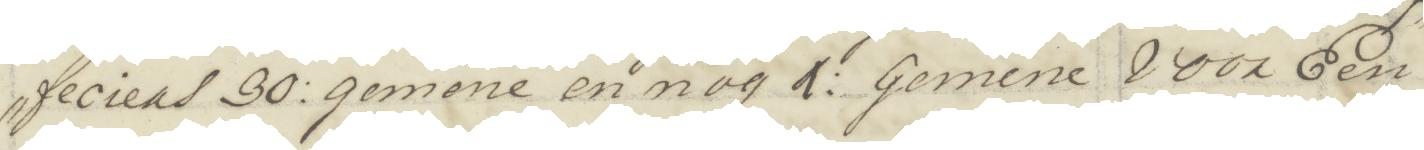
„feciers 30: gemene en nog 1: gemene voor Een
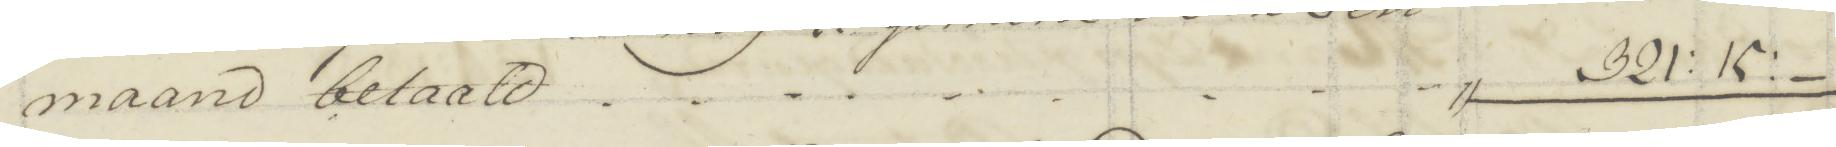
maand betaald - - - - - - - - - „ 321: 15:—
